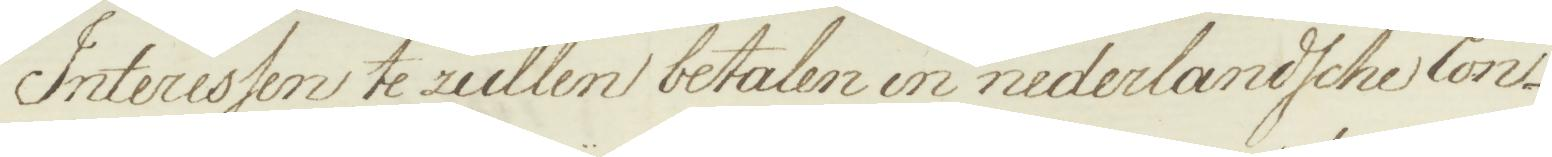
Interessen te zullen betalen in nederlandsche Con=
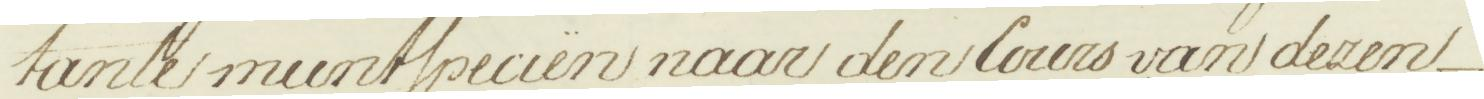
tante muntspecien naar den Cours van dezen —
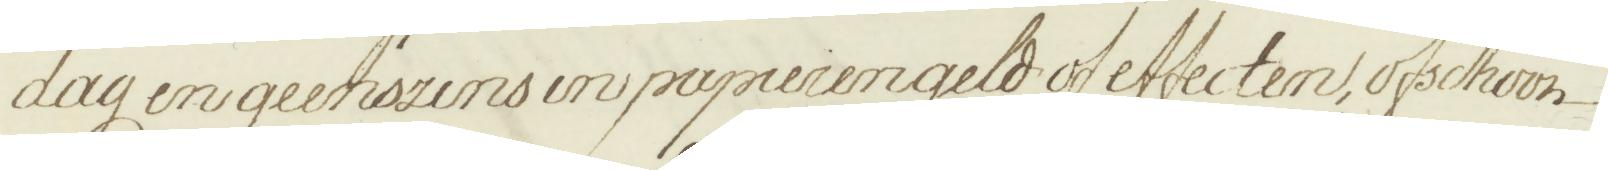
dag en geenszins in papierengeld of effecten, ofschoon
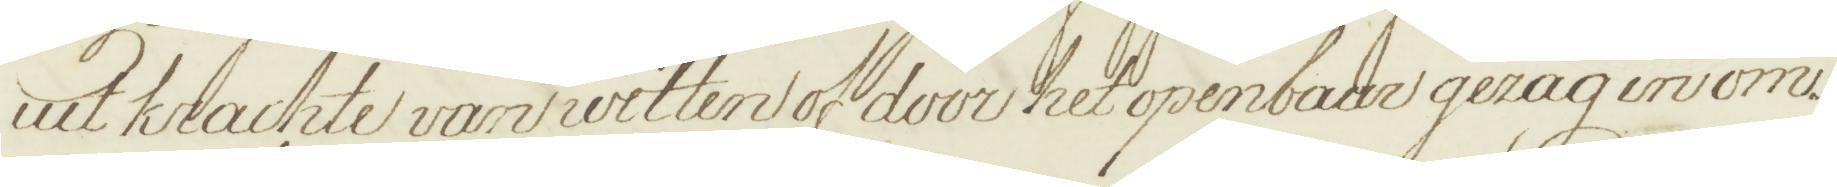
uit krachte van wetten of door het openbaar gezag in om„
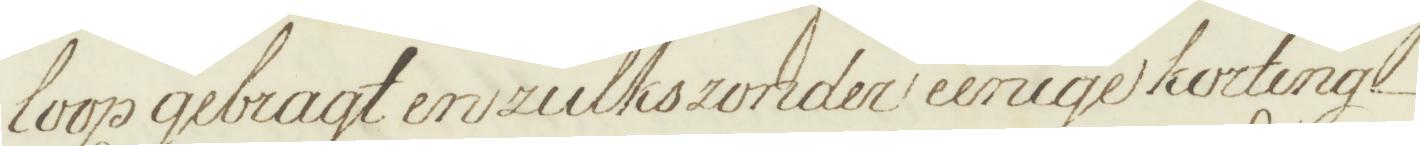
loop gebragt en zulks zonder eenige korting—
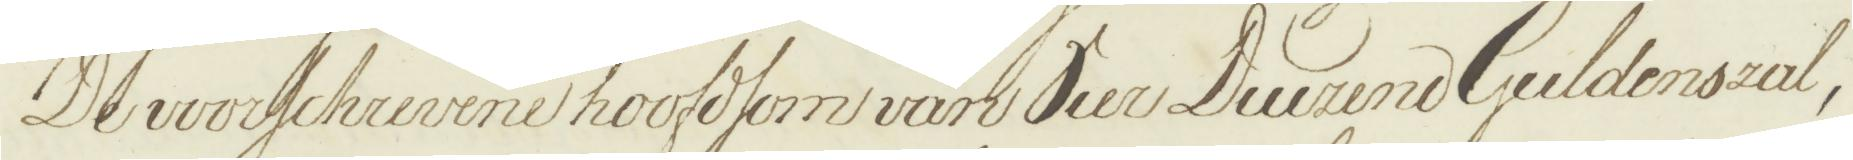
De voorschrevene hoofdsom van Vier Duizend Guldens zal,
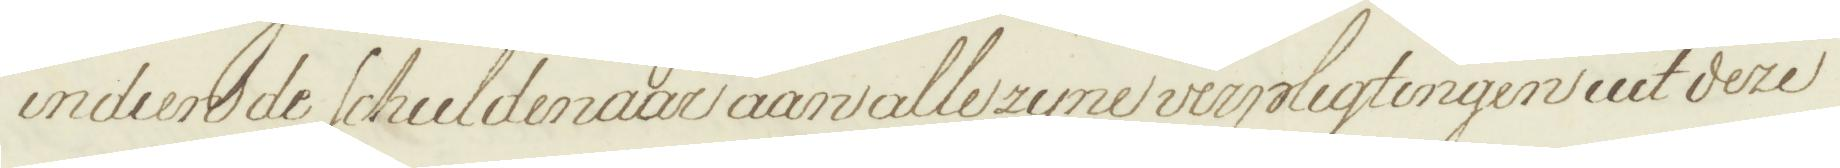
indien de schuldenaar aan alle zyne verpligtingen uit deze
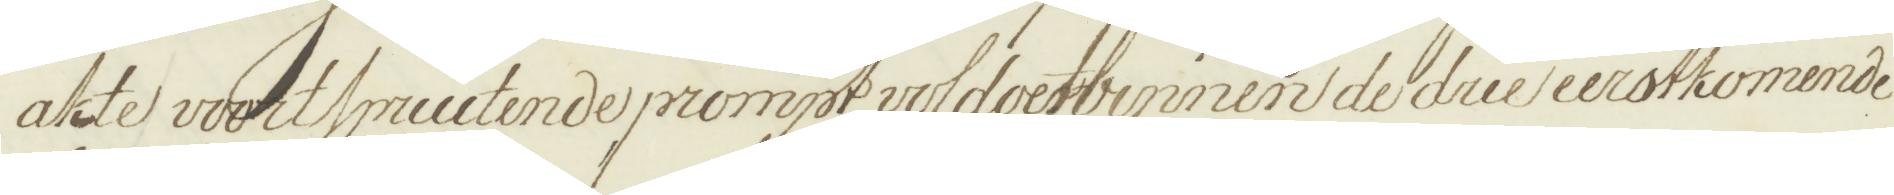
akte voortspruitende, prompt voldoet binnen de drie eerstkomende
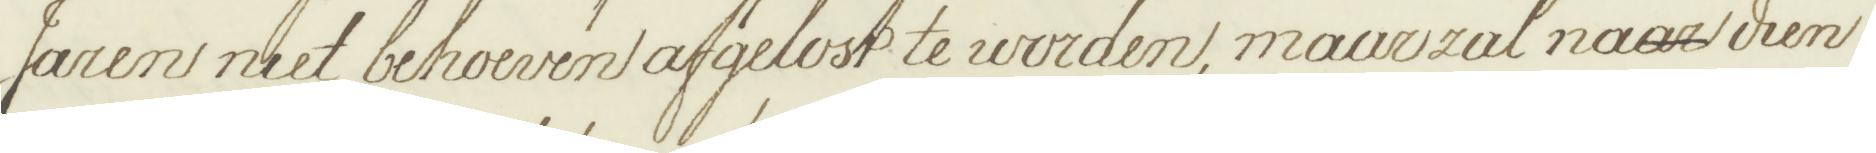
Jaren niet behoeven afgelost te worden, maar zal naar dien
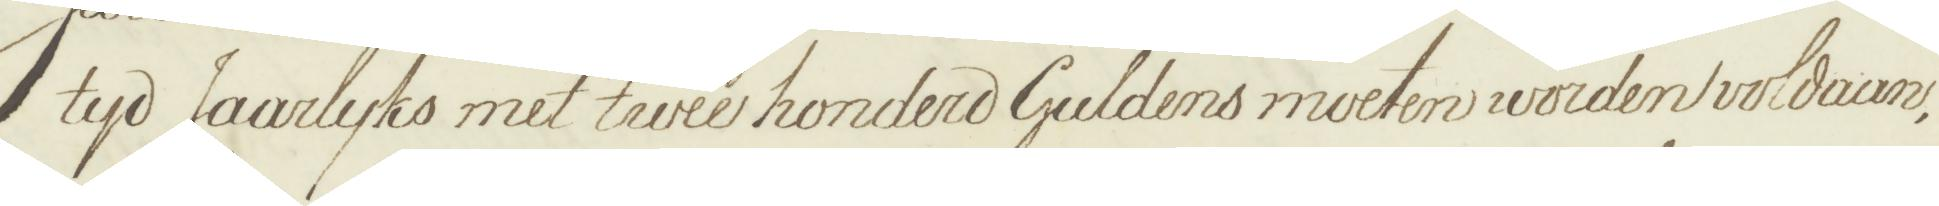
tyd Jaarlyks met twee honderd Guldens moeten worden voldaan,
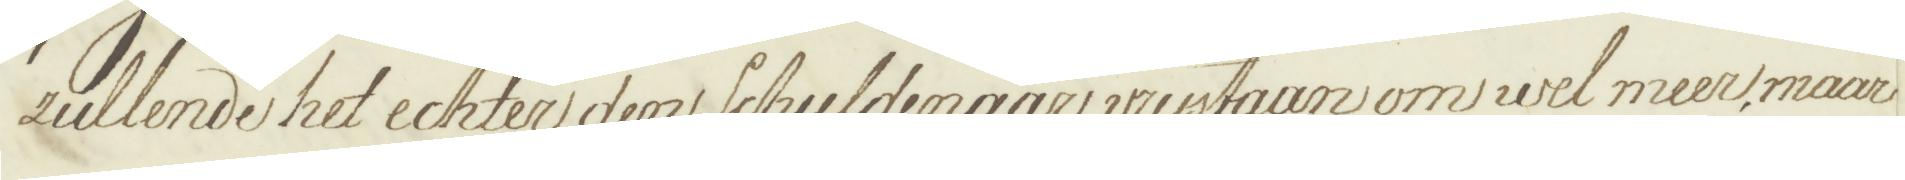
zullende het echter den schuldenaar vrystaan om wel meer, maar
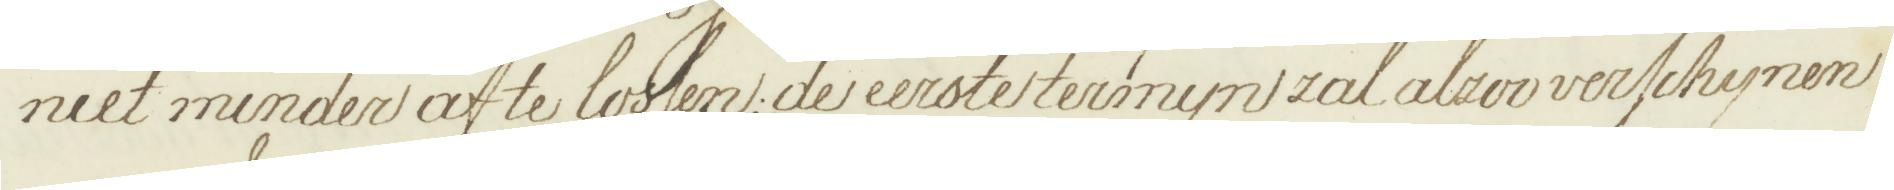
niet minder af te lossen; de eerste termyn zal alzoo verschynen
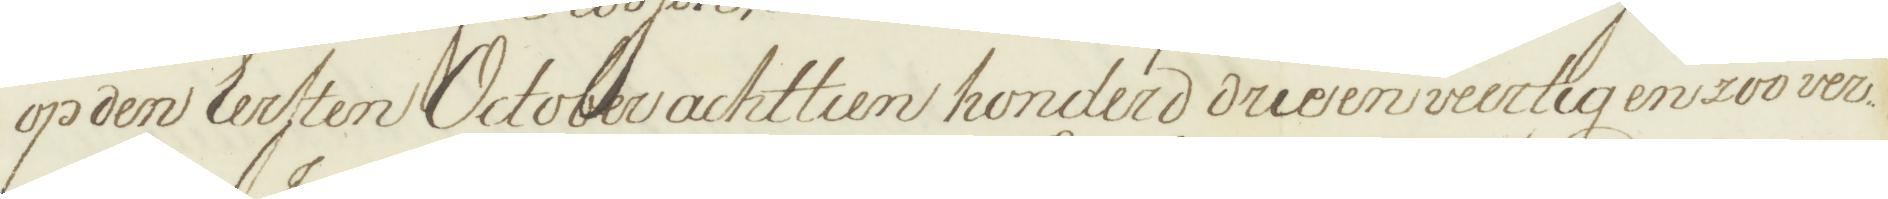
op den Eersten October achttien honderd drie en veertig en zoo ver„
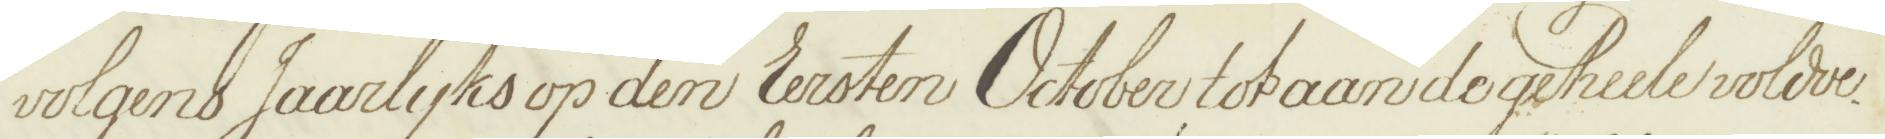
volgens Jaarlyks op den Eersten October, tot aan de geheele voldoe„
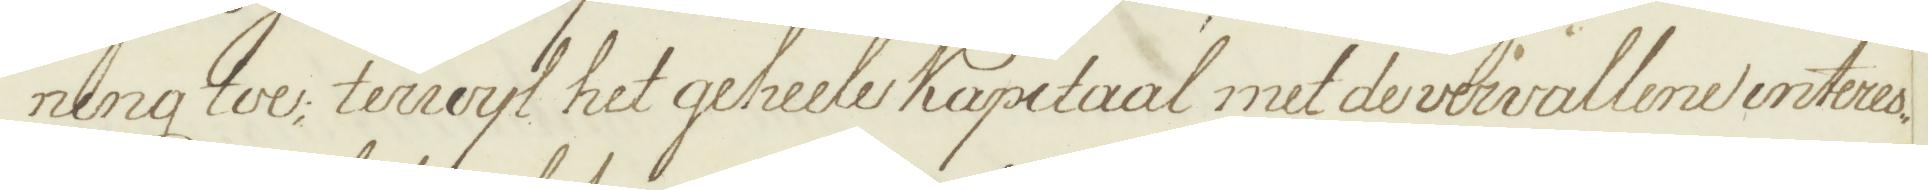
ning toe: terwyl het geheele Kapitaal met de vervallene interes„
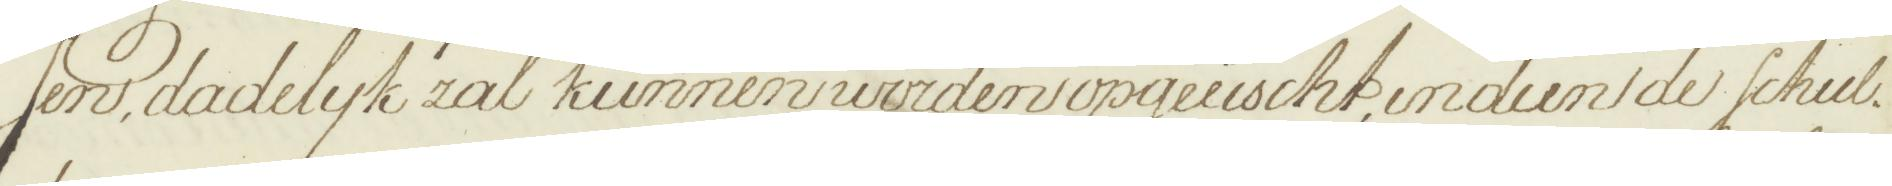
sen, dadelyk zal kunnen worden opgeëischt, indien de schul„
